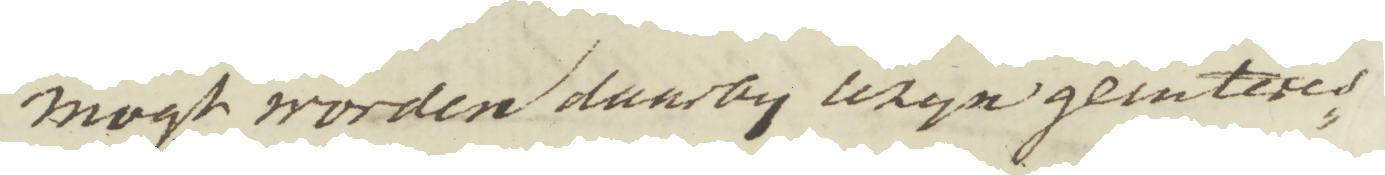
mogt worden daarby tezyn geinteres„
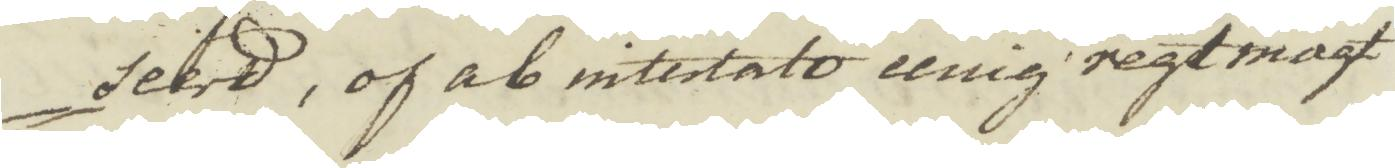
=seerd , of ab intestato eenig regt mogt
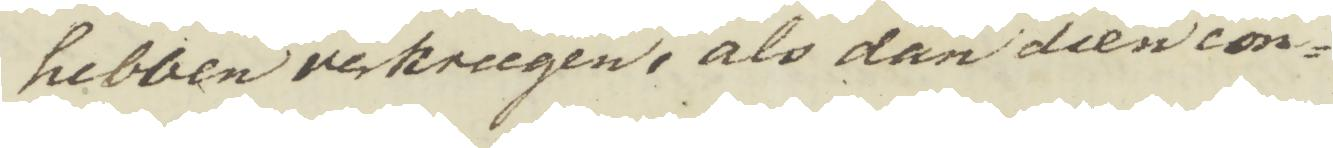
hebben verkreegen, als dan dien con=
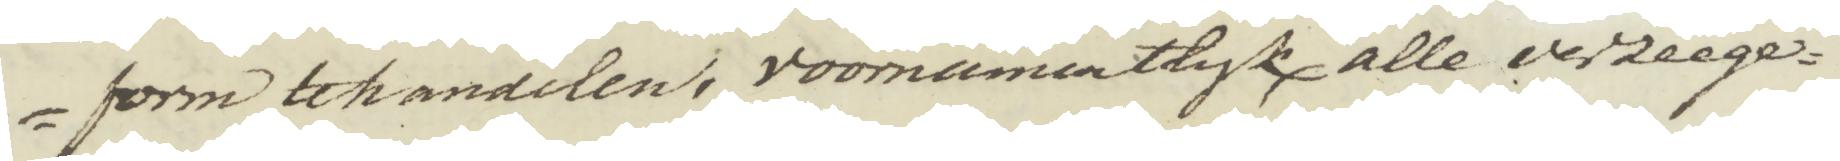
=form te handelen, voornamentlijk alle verzeege=
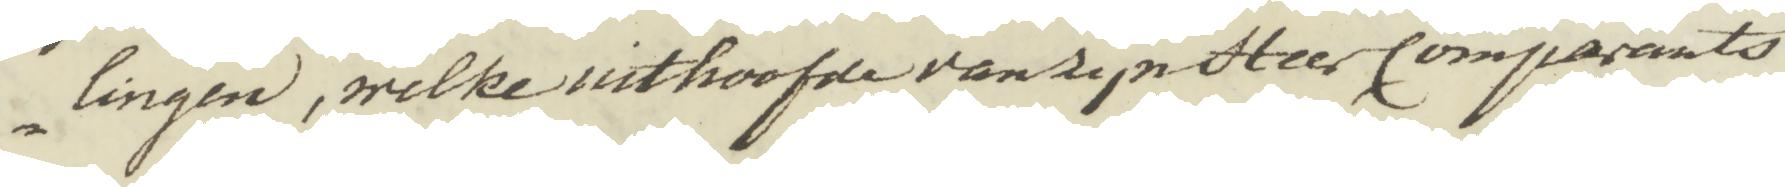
=lingen, welke uithoofde van zyn Heer Comparants
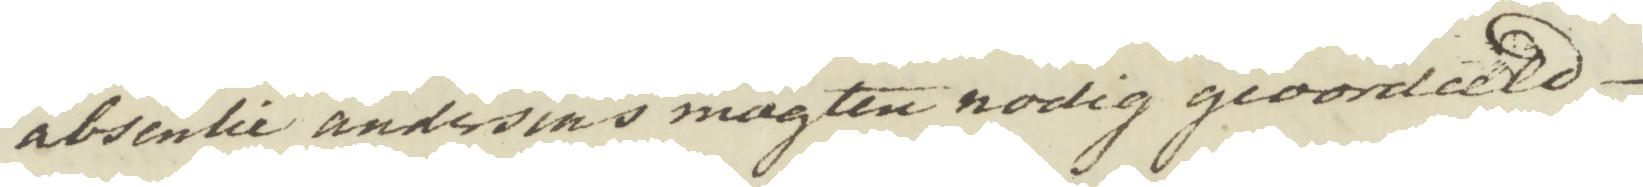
absentie andersins mogten nodig geoordeeld —
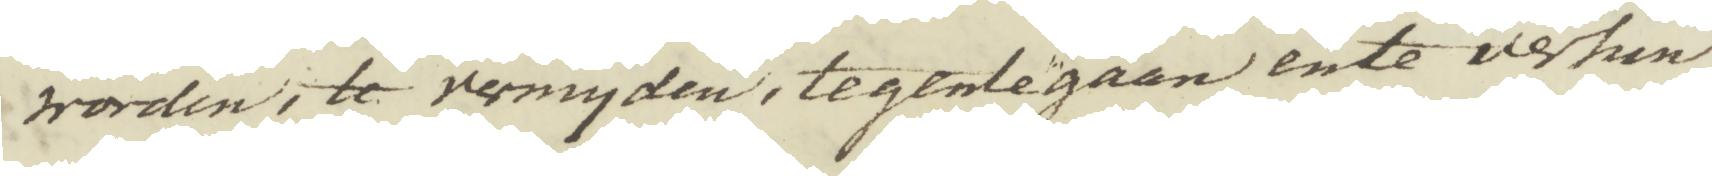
worden, te vermyden, tegen te gaan en te verhin
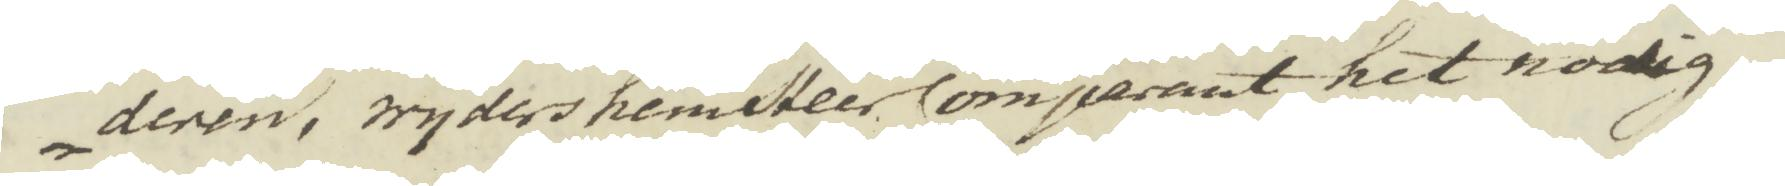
„deren, wyders hem Heer Comparant het nodig
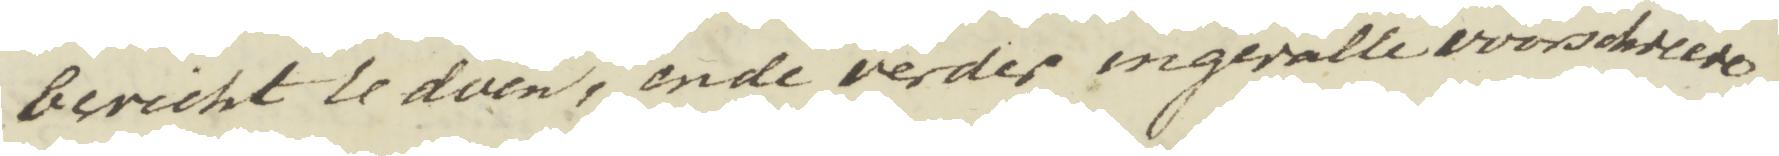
bericht te doen, ende verder ingevalle voorschreeve
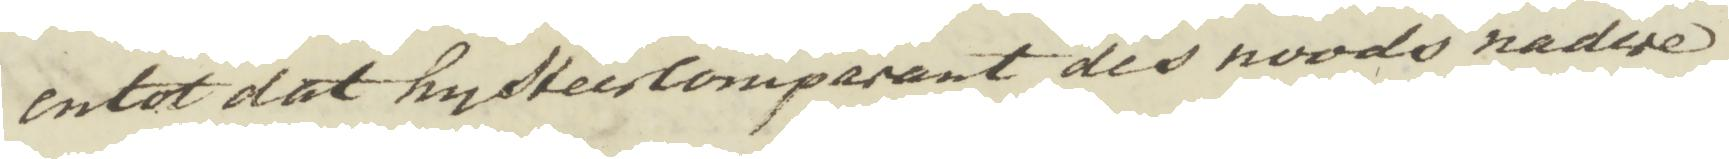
en tot dat hy Heer Comparant des noods nadere
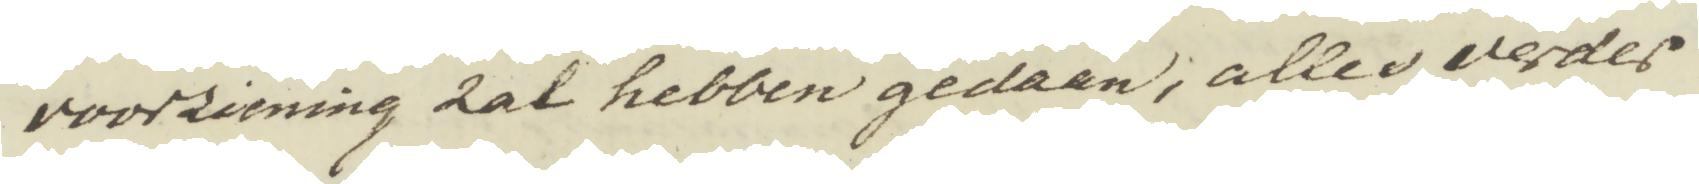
voorziening zal hebben gedaan; alles verder
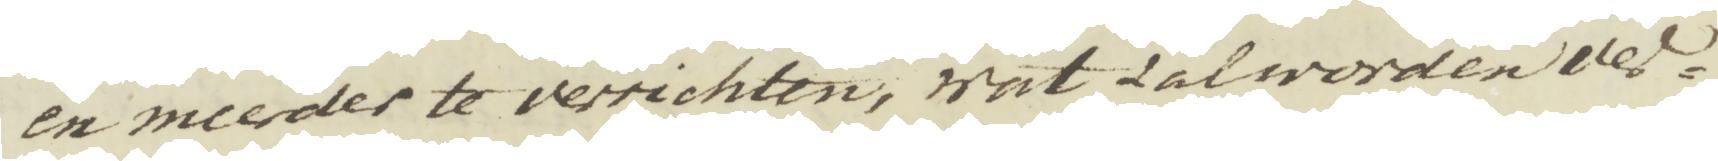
en meerder te verrichten, wat zal worden ver=
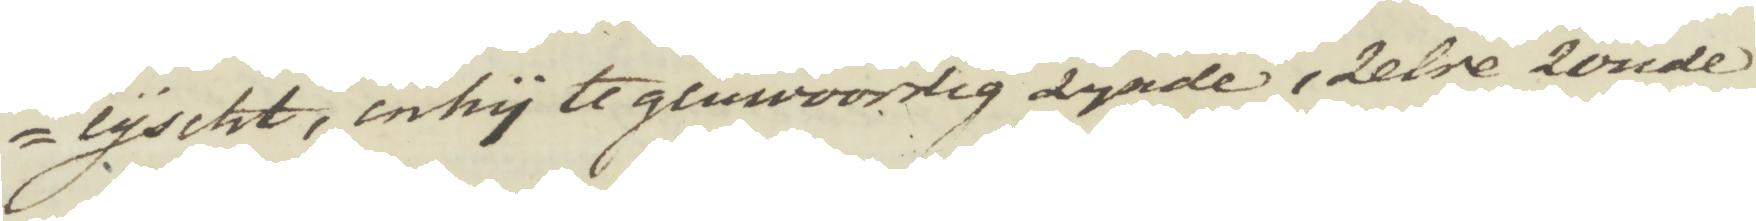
=eijscht, en hij tegenwoordig zynde ,zelve zoude
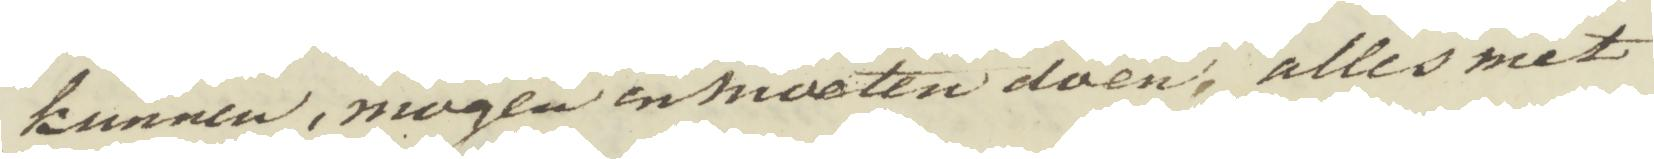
kunnen, mogen en moeten doen, alles met
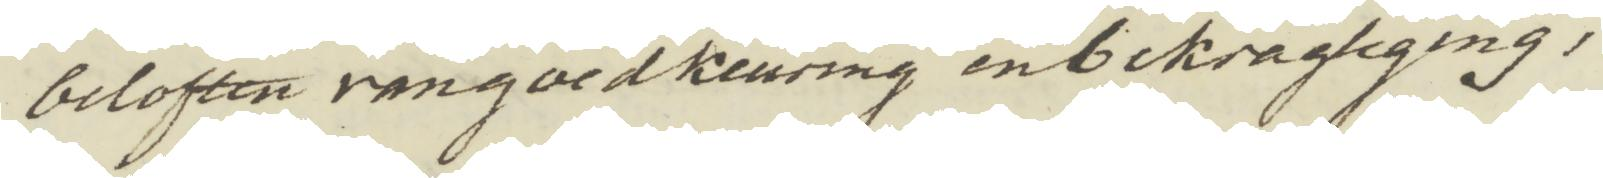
beloften van goedkeuring en bekragtiging,
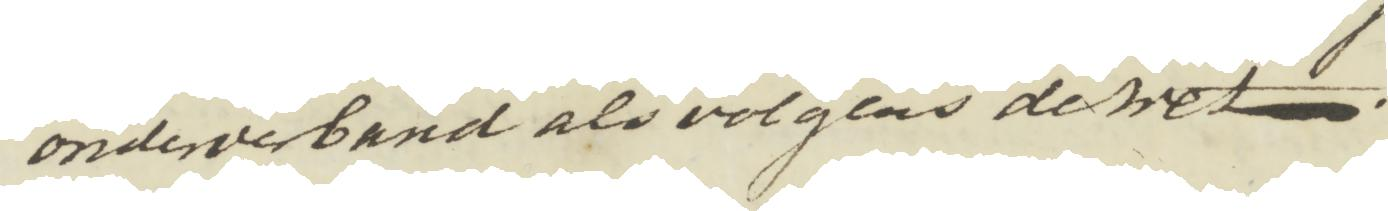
onderverband als volgens de wet.
